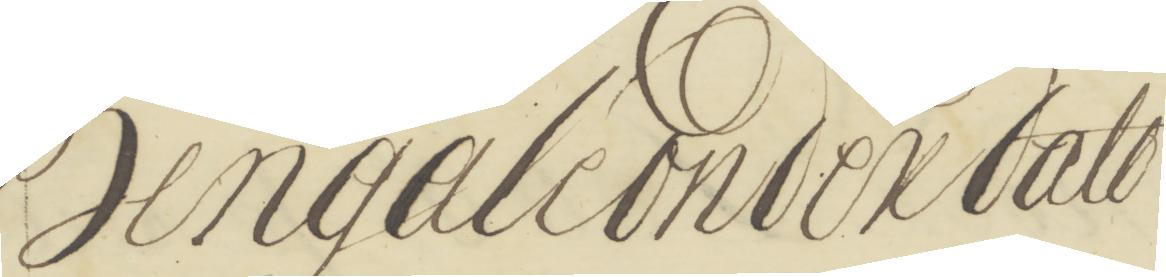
Van Bengale onder dato 8„en Janu: 1726.
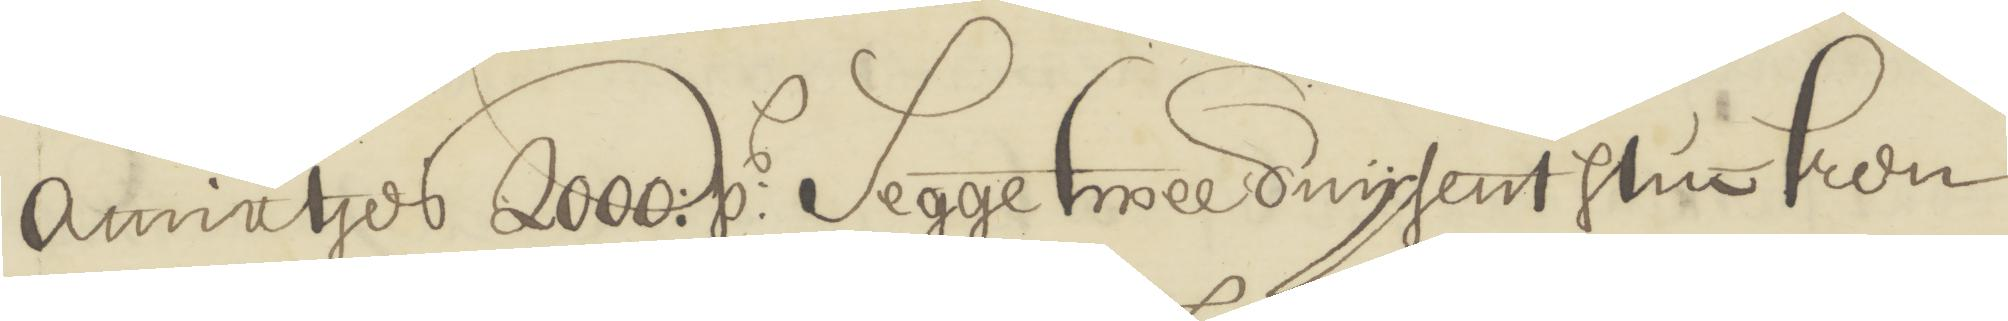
amirtjes 2000: p:s Segge twee duijsent stucken
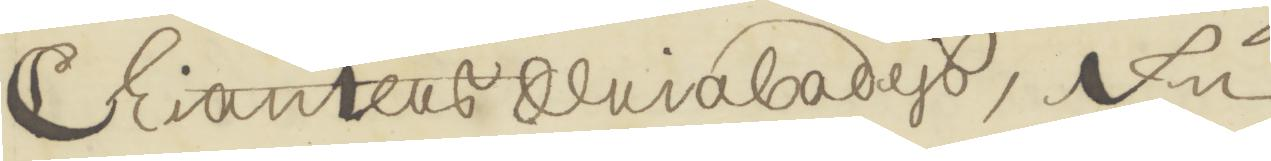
Chianters deriabadijs, En
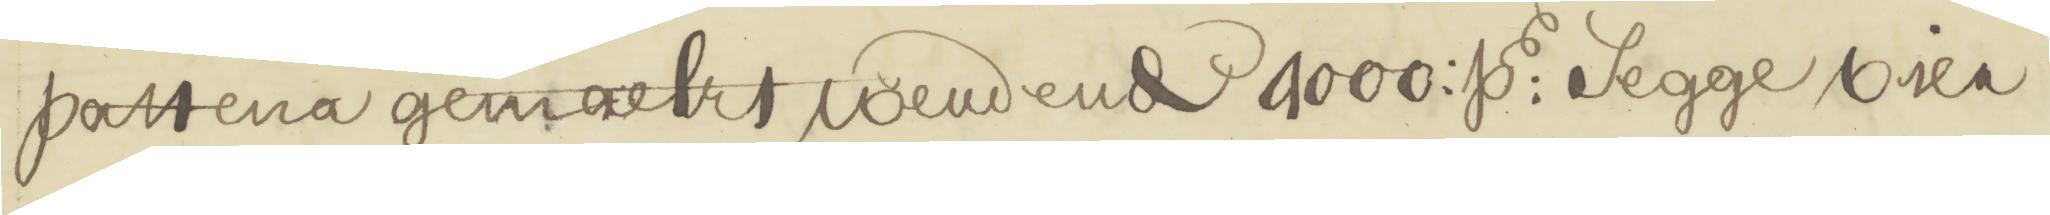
pattena gemaekt werdende 4000: p:s segge vier
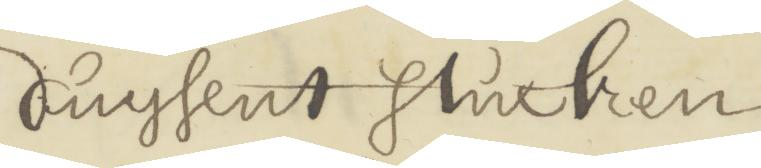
duysent stucken
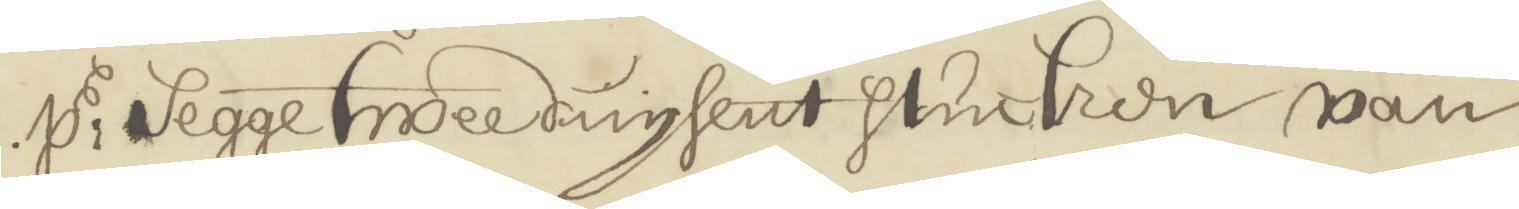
baftas 2000. p:s segge twee duijsent stucken van
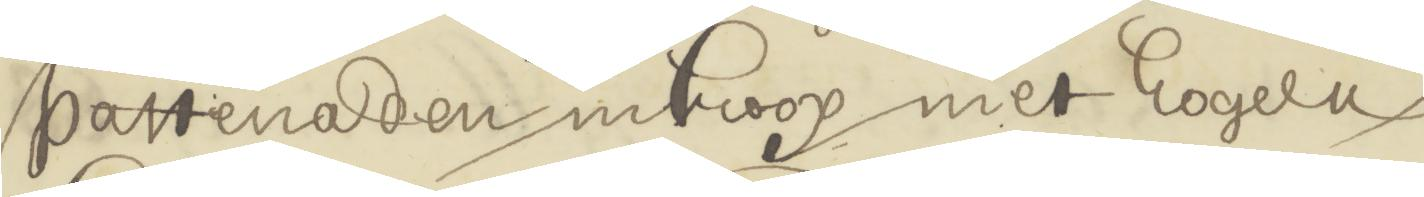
pattena den inkoop niet hoger
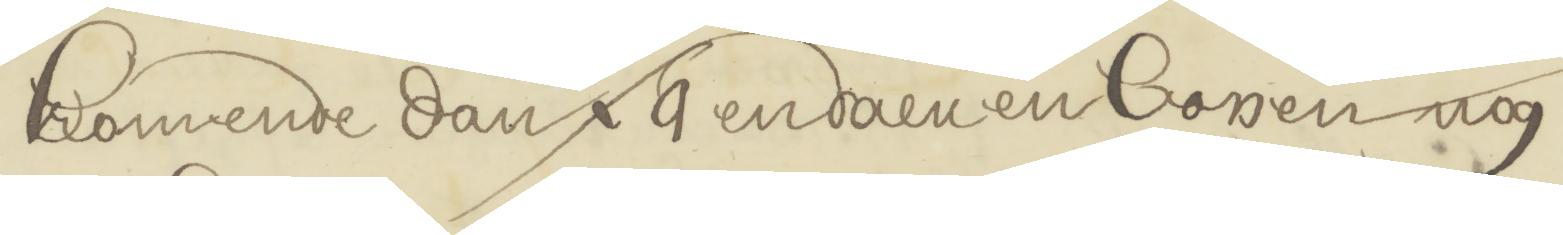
komende dan ƒ4 en daer en boven nog
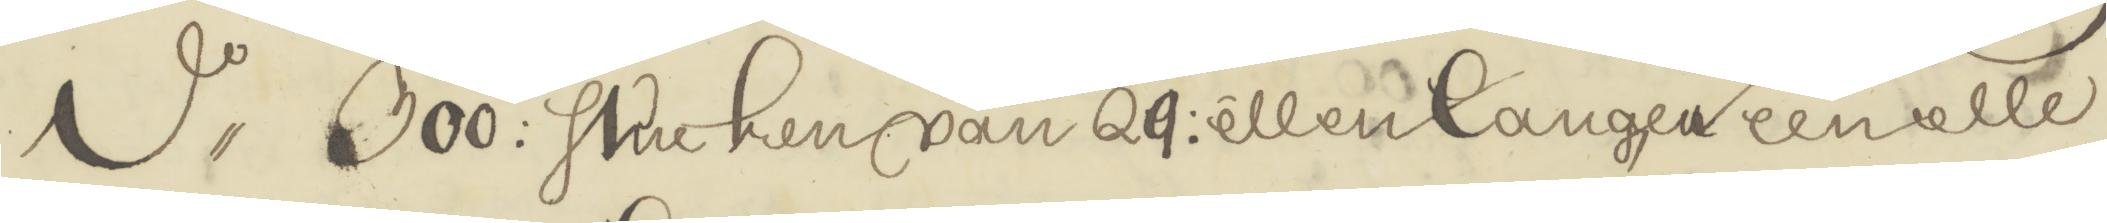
d„o 300: stucken van 24: ellen lang, en een elle
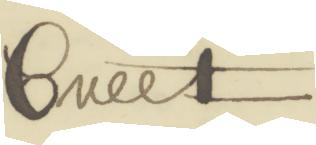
breet
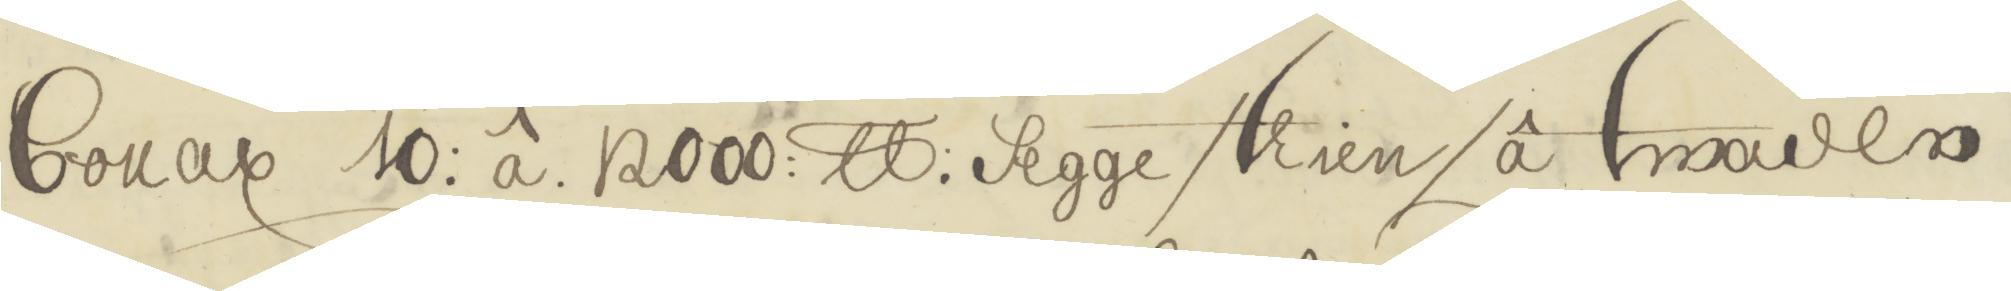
borax 10: â. 12000: lb: segge /thien/ â twaelv
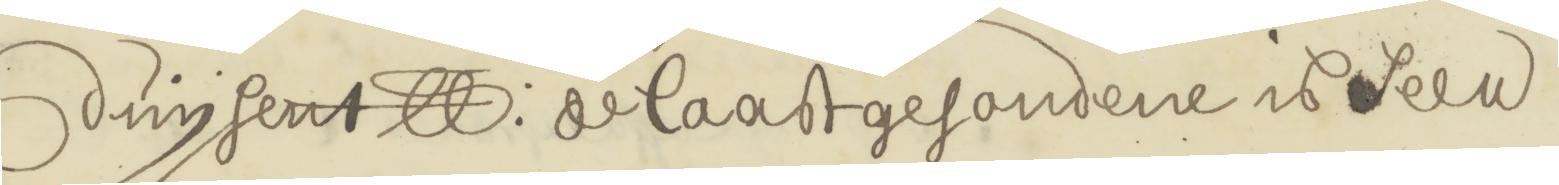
duijsent lb: de laastgesondene is seer
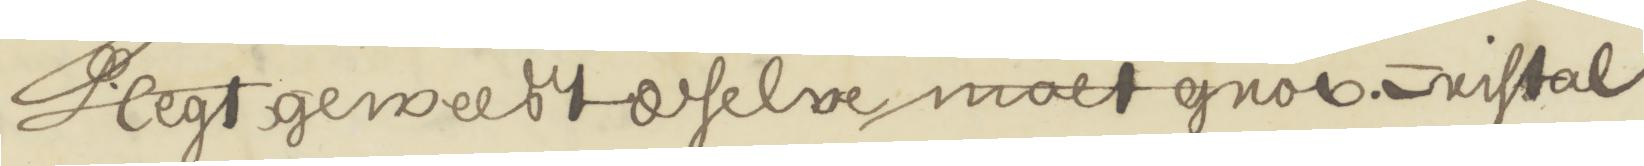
slegt geweest deselve moet grov cristal
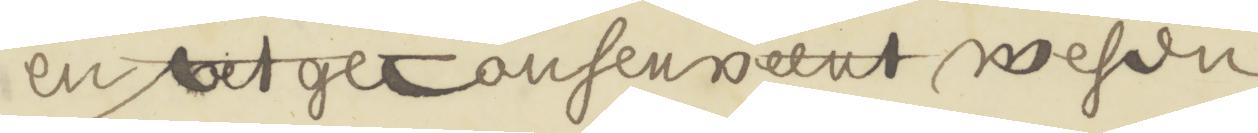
en vet geconserveert wesen
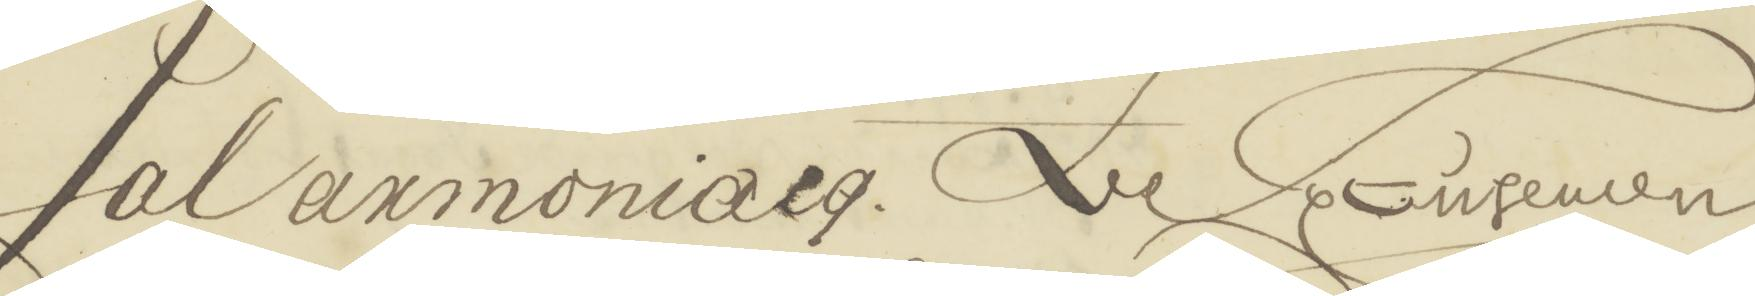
sal armoniacq. te Excuseren
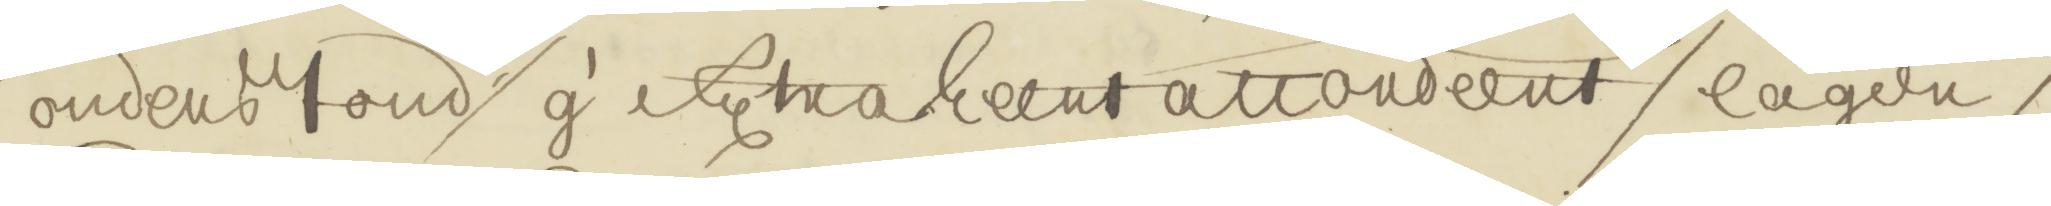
onderstond/ g’Extraheert accordeert / lager /
